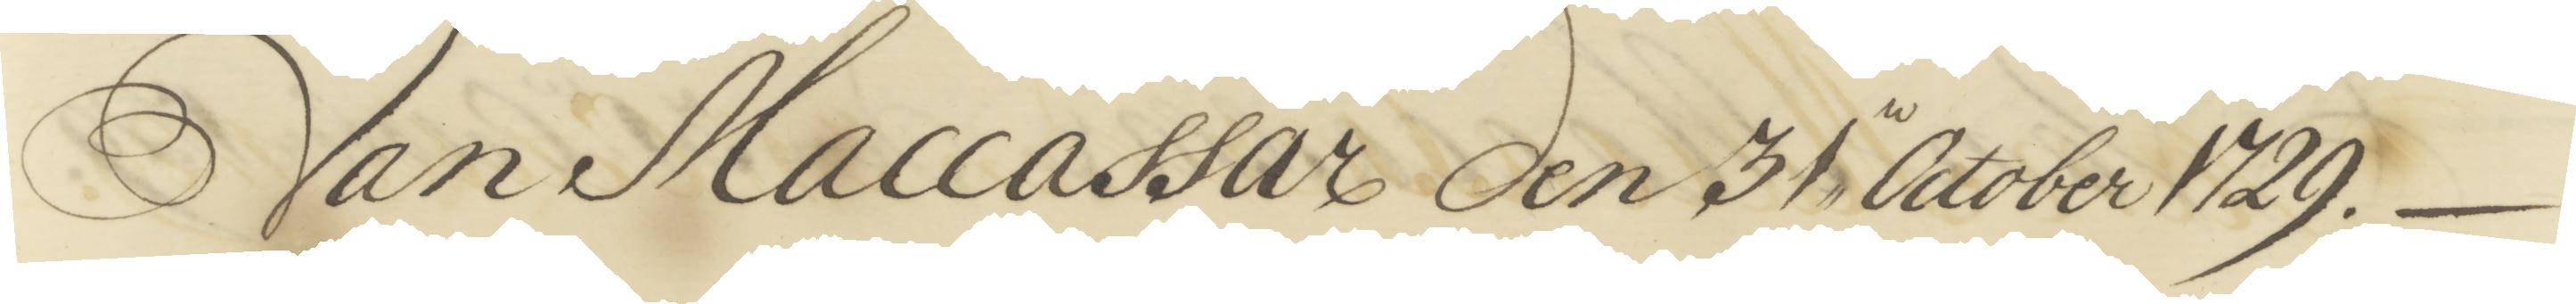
Van Maccassar Den 31„n October 1729. —
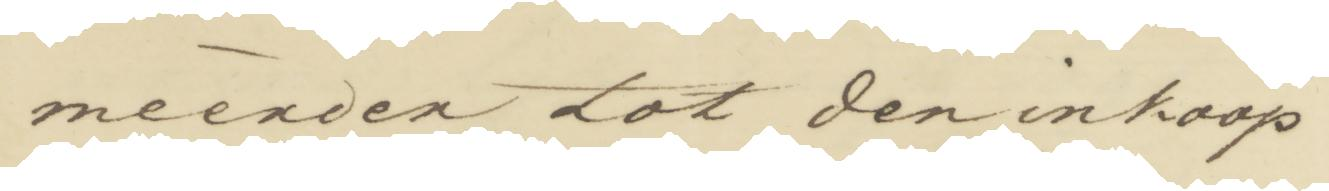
meerder tot den inkoop
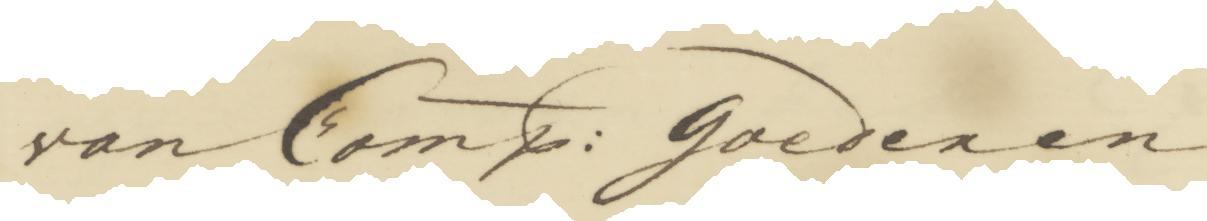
van Comp: goederen
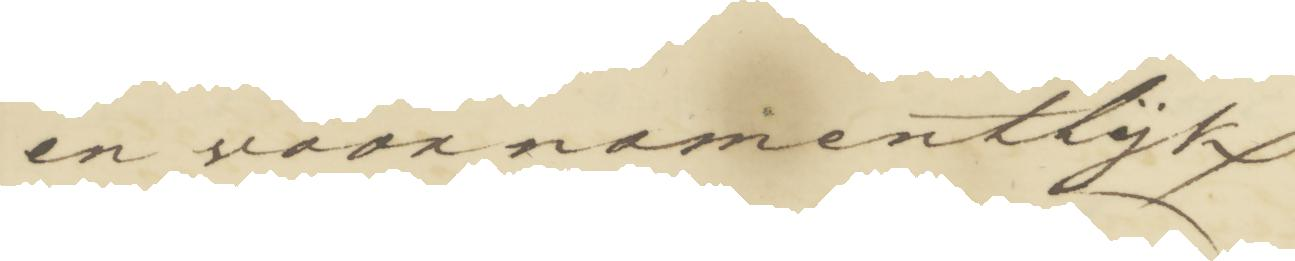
en voornamentlijk
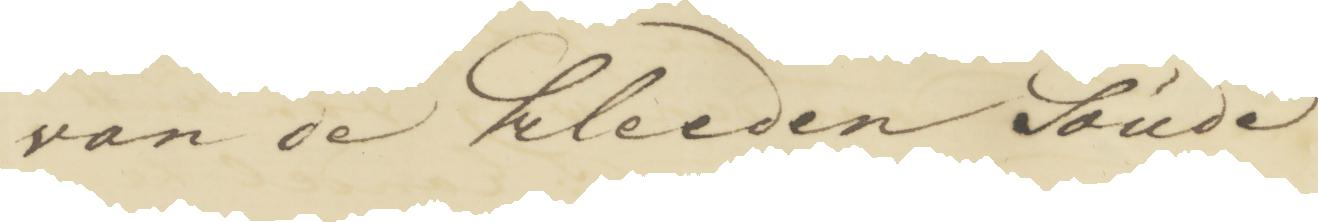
van de kleeden soude
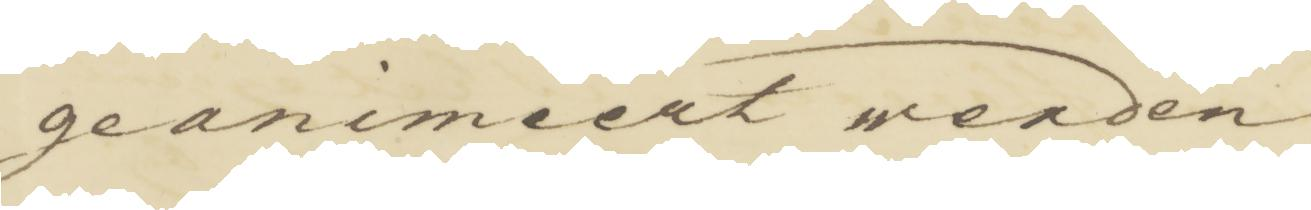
geanimeert werden
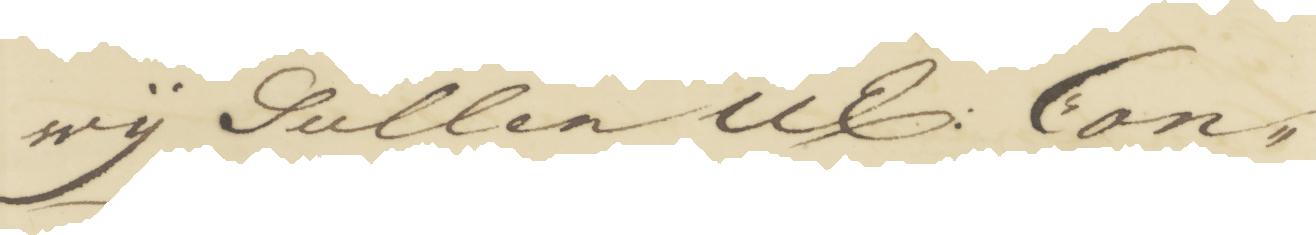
wij sullen uE: Con„
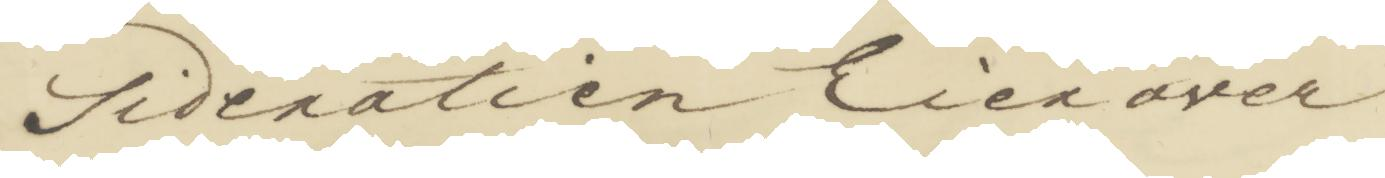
sideratien hier over
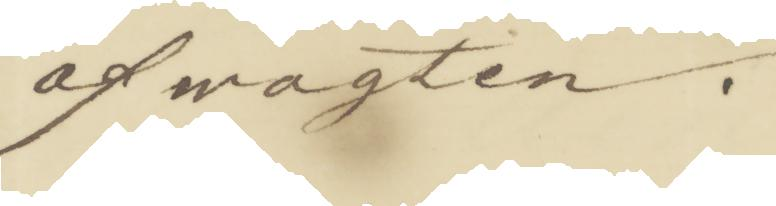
af wagten.
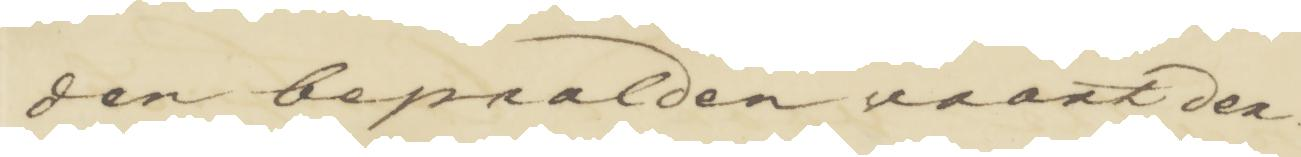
den bepaalden vaart der
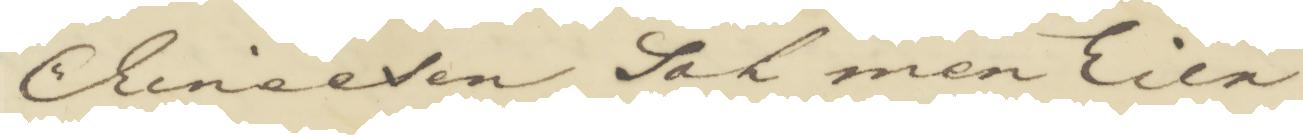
Chineesen sal men hier
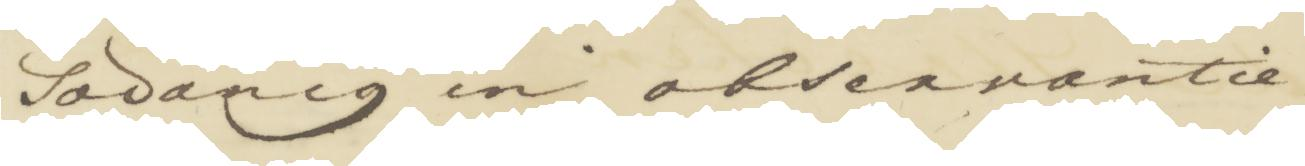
sodanig in observantie
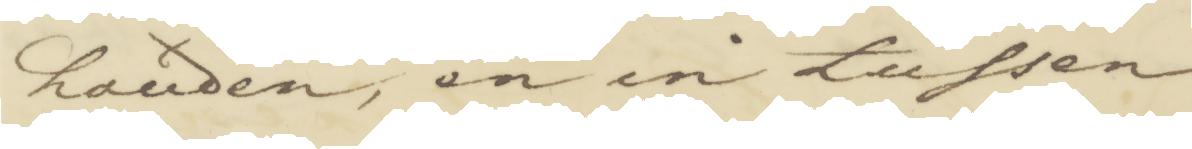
houden, en in tussen
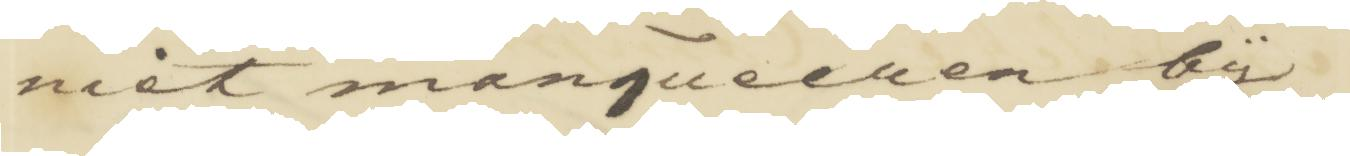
niet manqueeren bij
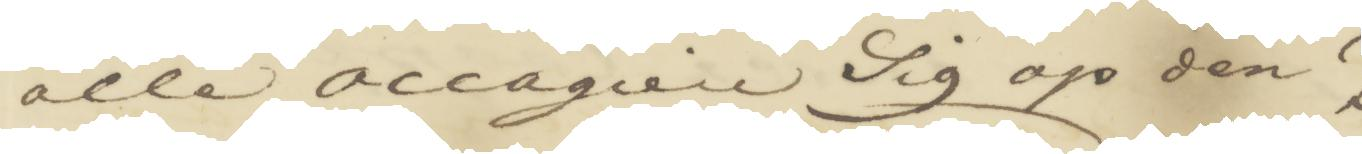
alle occagien sig op den
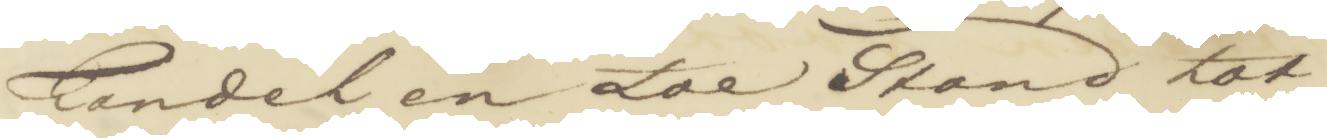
handel en toe stand tot
